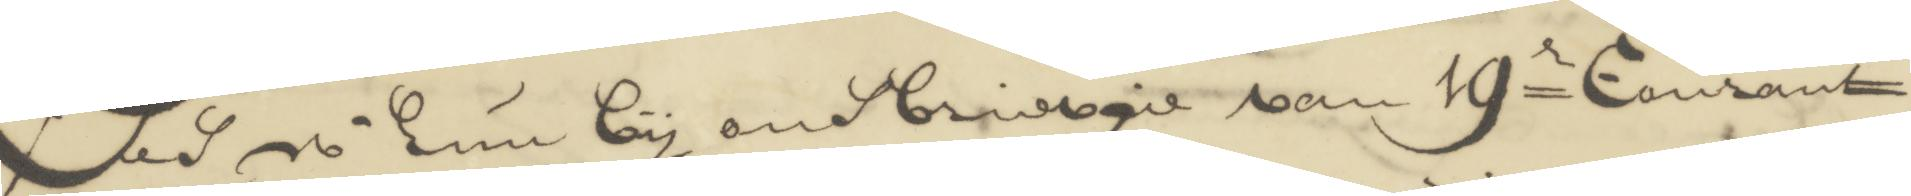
des w' hun bij ons brievje van 19=en Courant
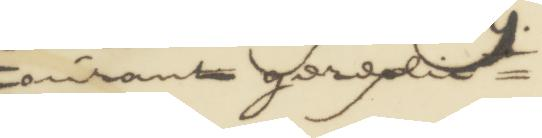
Courant gereplic=t
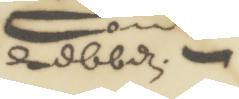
hebben;
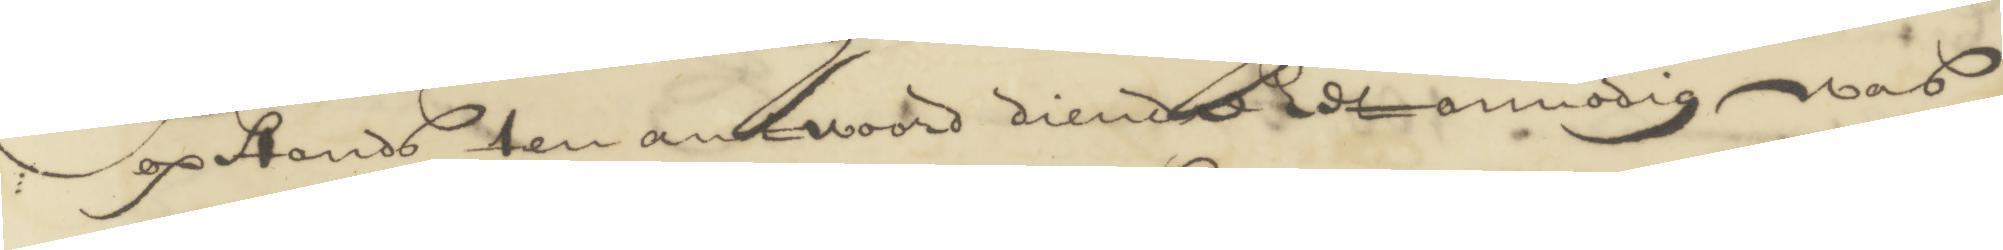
op stonds ten antwoord diende het onnodig was
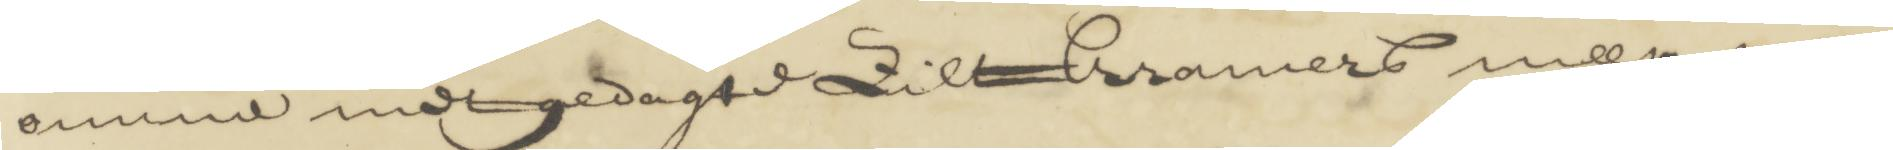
omme niet gedagte ziltkramers meer in
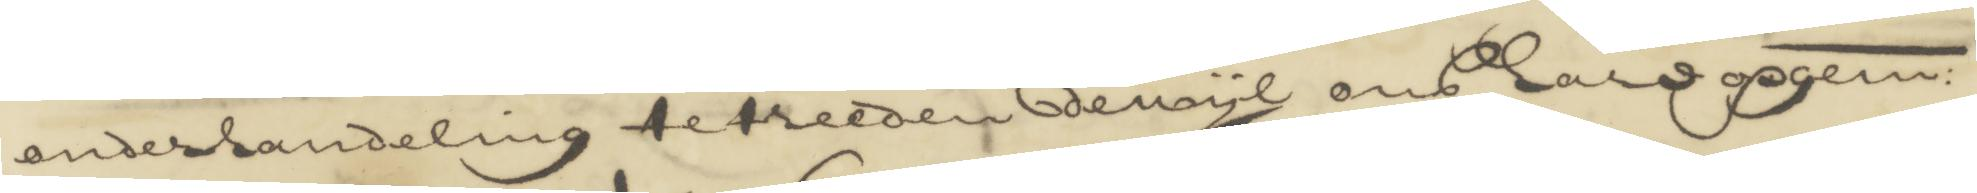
onderhandeling te treeden dewijl ons hare opgem:
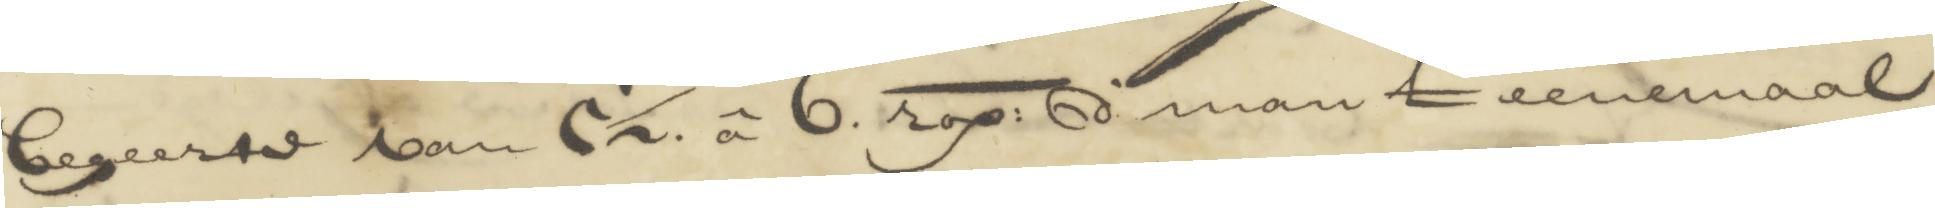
begeerte van 5½. â 6. rop: d' man t' eenemaal
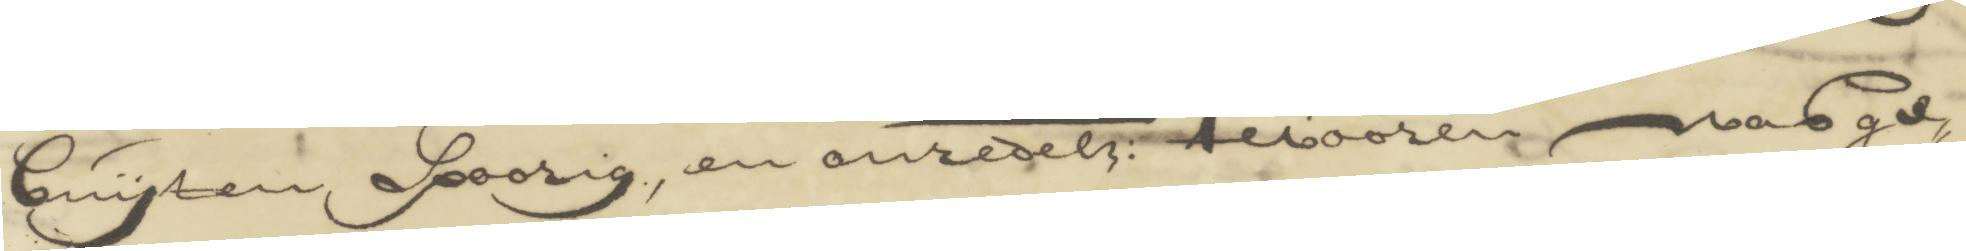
buijten spoorig., en onredelijk tevooren was ge„
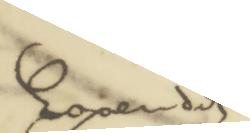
hopen den
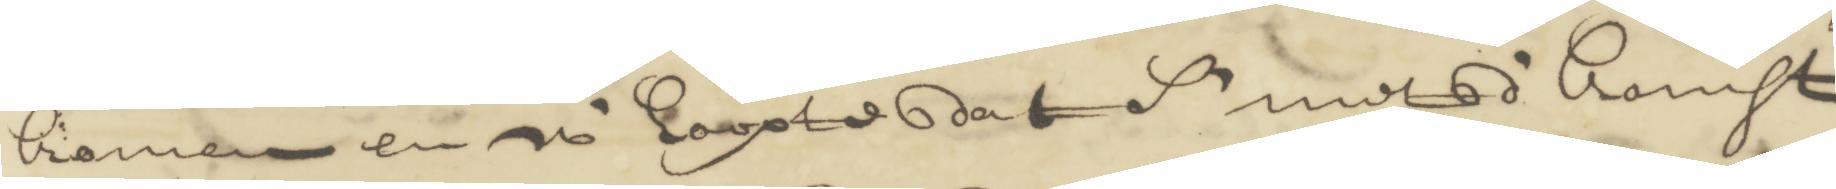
komen en w' hoopte dat s' met d’ komst
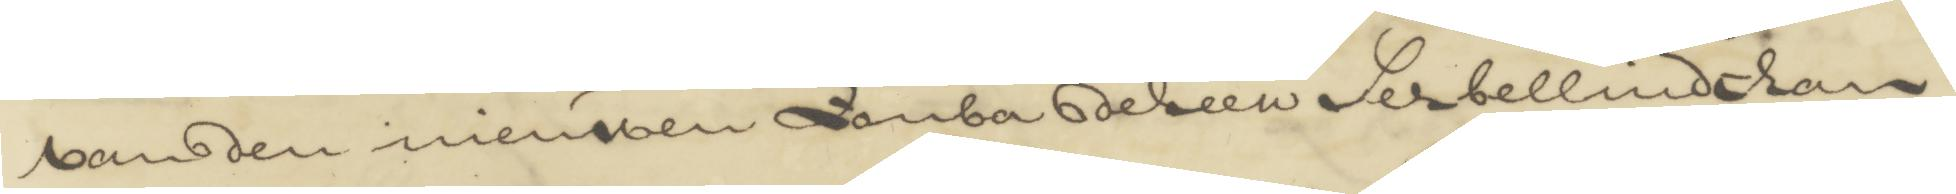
van den nieuwen zouba de heer serbellindchan
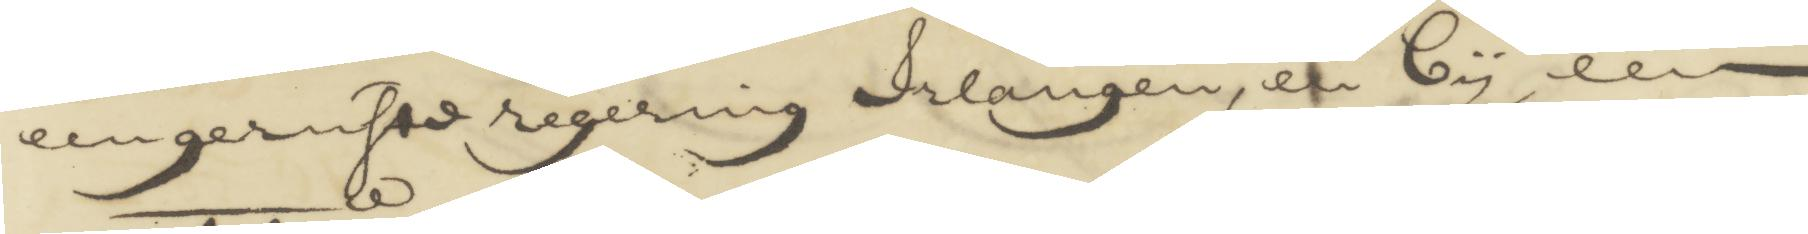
een geruste regering Erlangen, en bij een
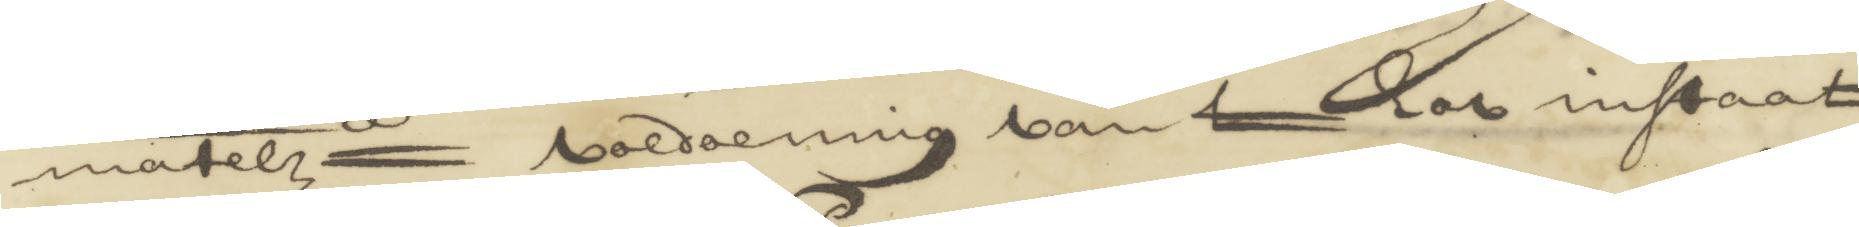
matelijk=e voldoening van 't hoe instaat
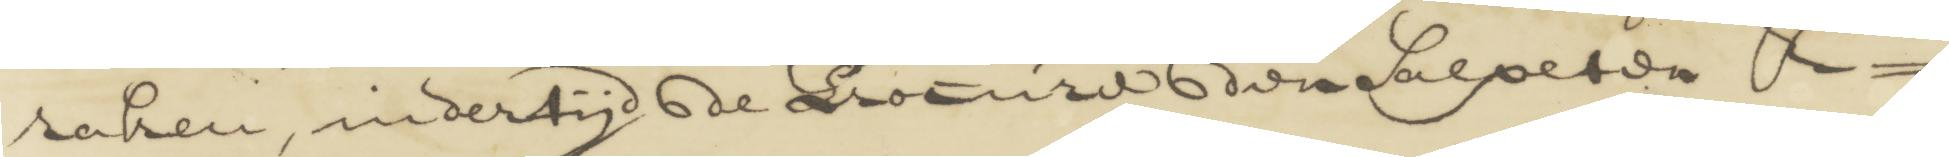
raken, indertijd de procure den salpeter &=a
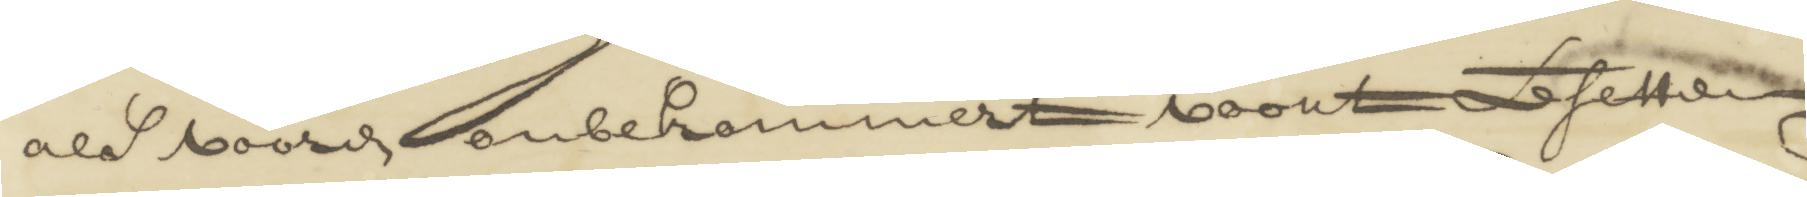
als vooren onbekommert voort tesetten
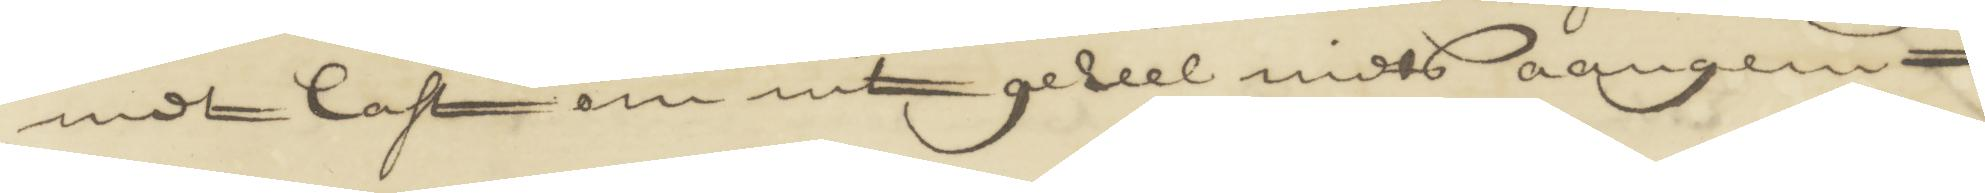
met last om in’t geheel niets aangem=n
